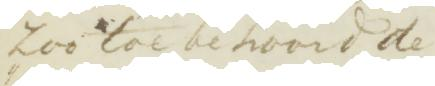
„zoo toe behoord de
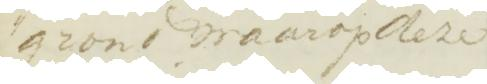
grond, waarop deze
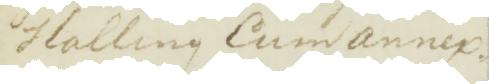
stalling Cum annex
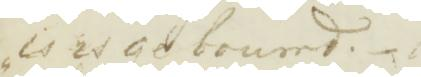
is is gebouwd.—
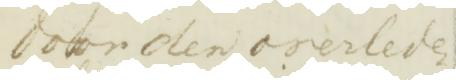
door den overlede
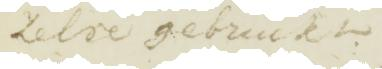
zelve gebruikt.
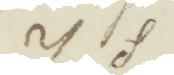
J S
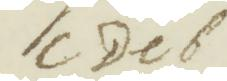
c. De b
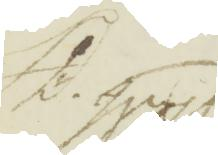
TDamers
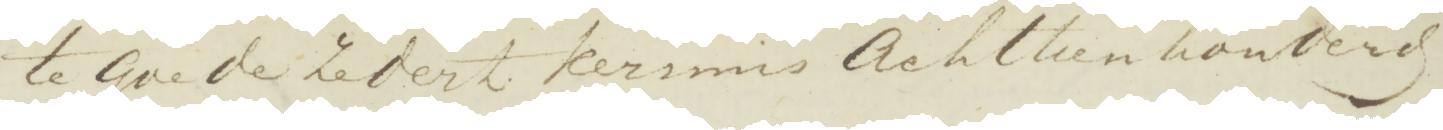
te goede zedert kersmis Achttien honderd
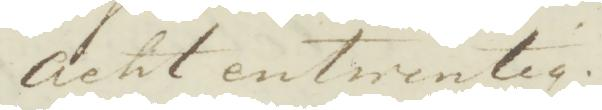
Acht en twintig.
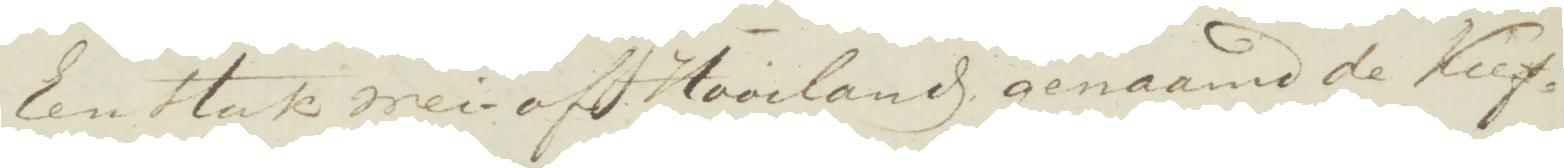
Een stuk wei- of Hooiland, genaamd de Kief„
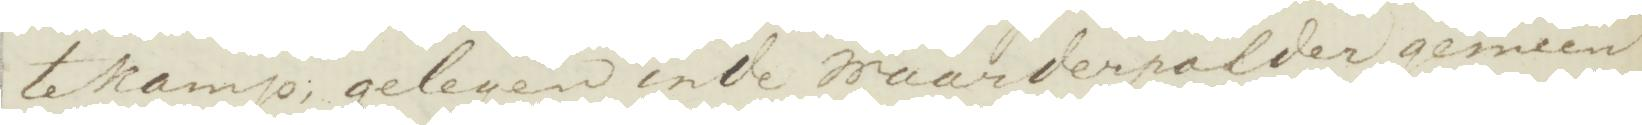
te kamp, gelegen in de Waarderpolder gemeen
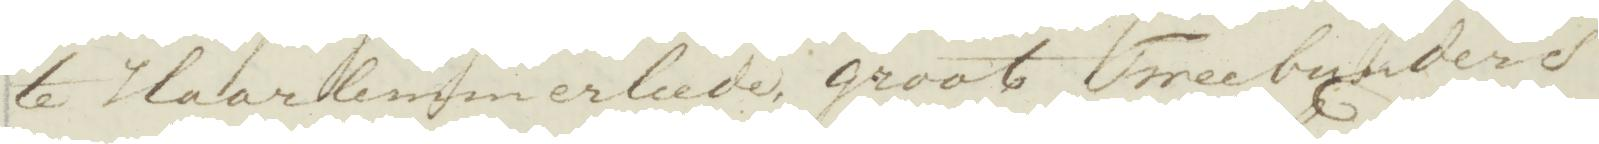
te Haarlemmerliede, groot Twee bunders
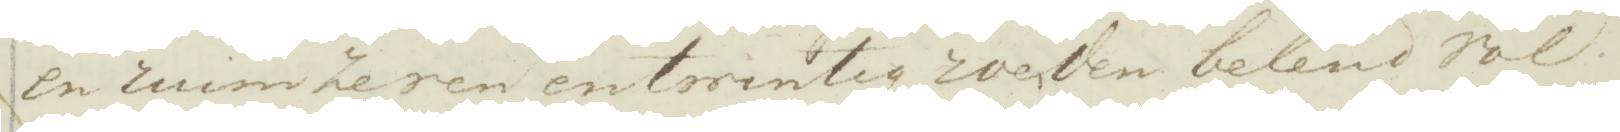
en ruim zeven en twintig roeden belend vol
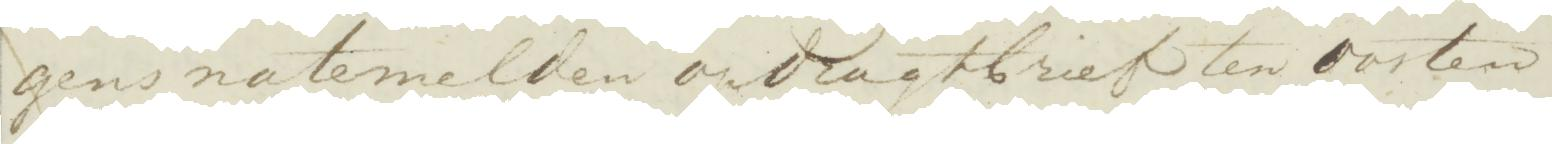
gens natemelden opdragtbrief ten oosten
